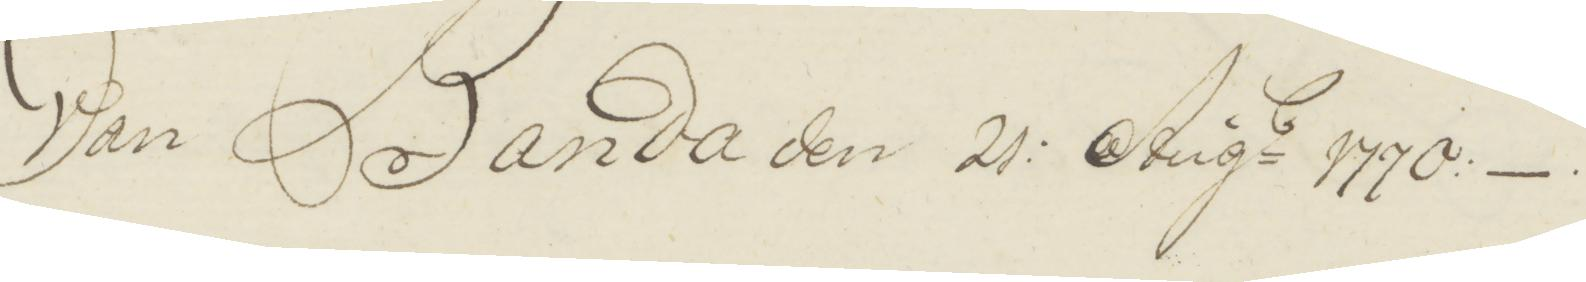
Van Banda den 21: Aug:s 1770:—.
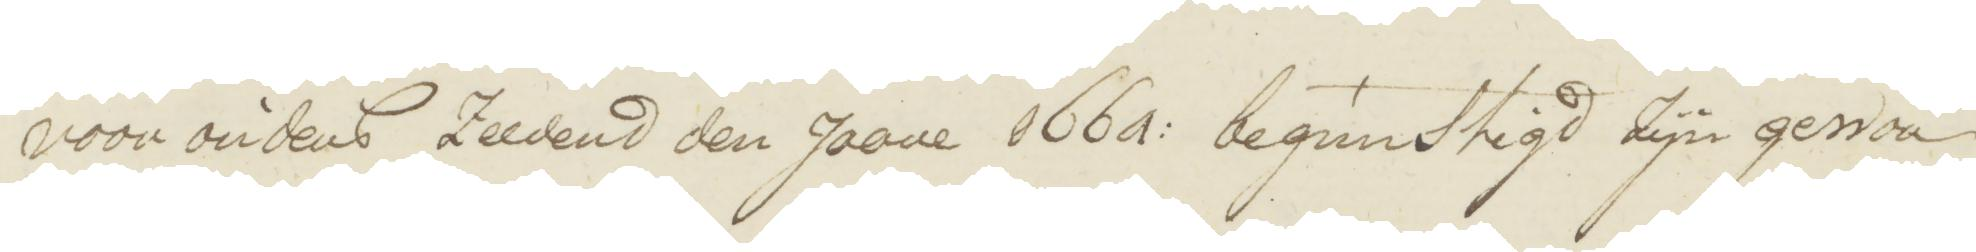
voor ouders zeederd den Jaare 1664: begunstigd zijn gewor
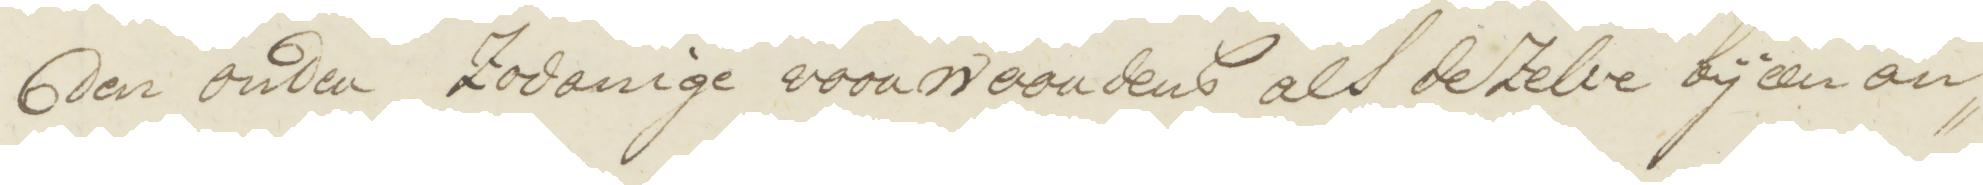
den onder zodanige voorwaardens als dezelve bij een an„
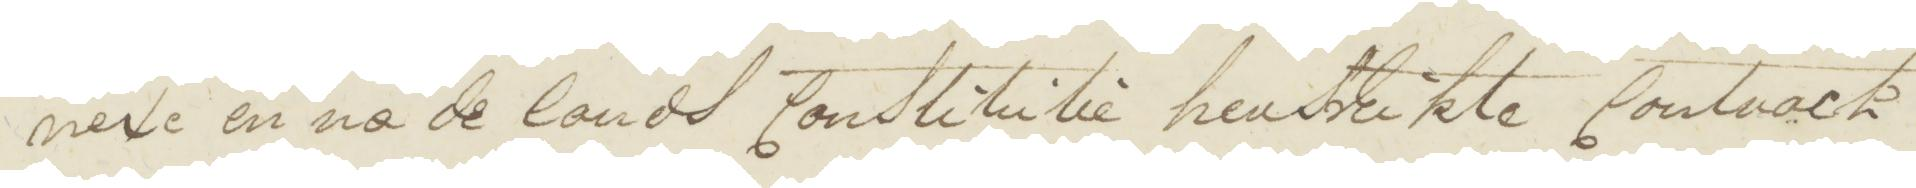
nexe en na de lands constitutie herschikte contract
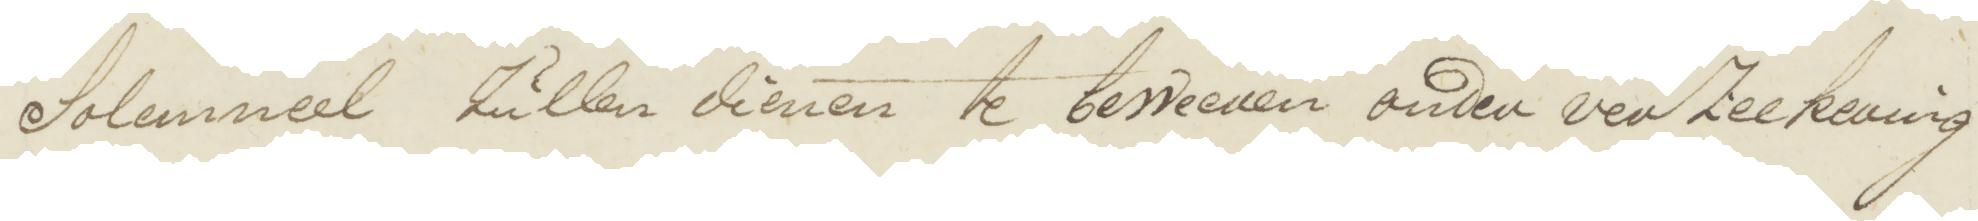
solemneel zullen dienen te beweeren onder verzeekering
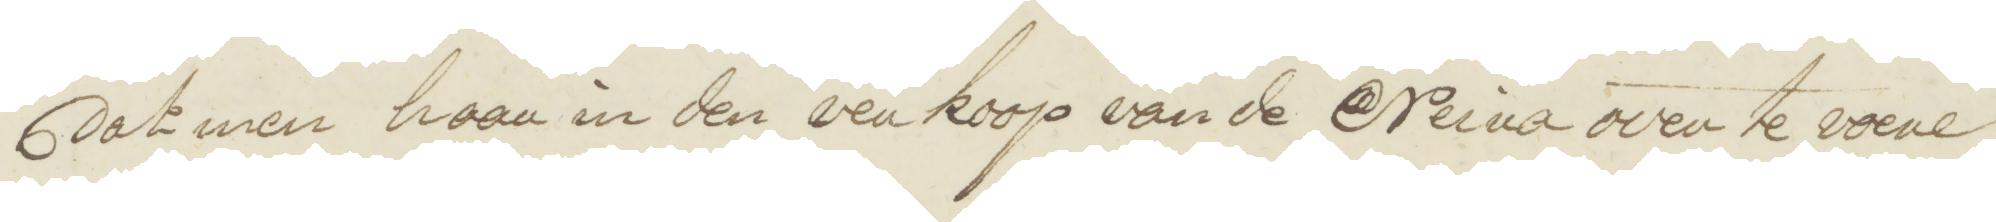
dat men haar in den verkoop van de Neira over te voere
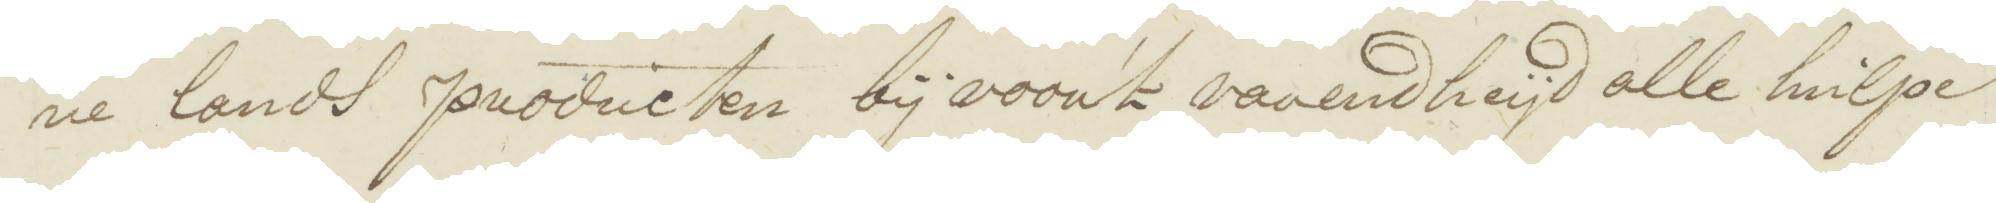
ne lands producten bij voor 't varendheijd alle hulpe
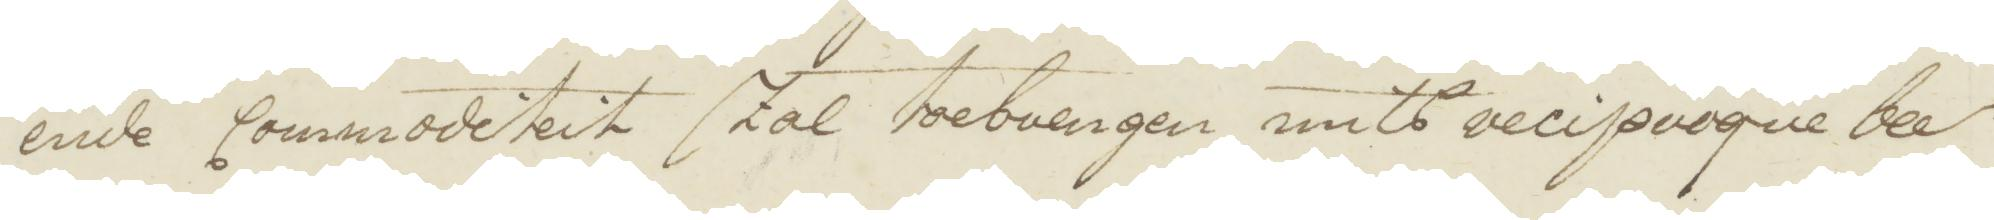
ende commoditeit zal toebrengen, mits reciproque bee
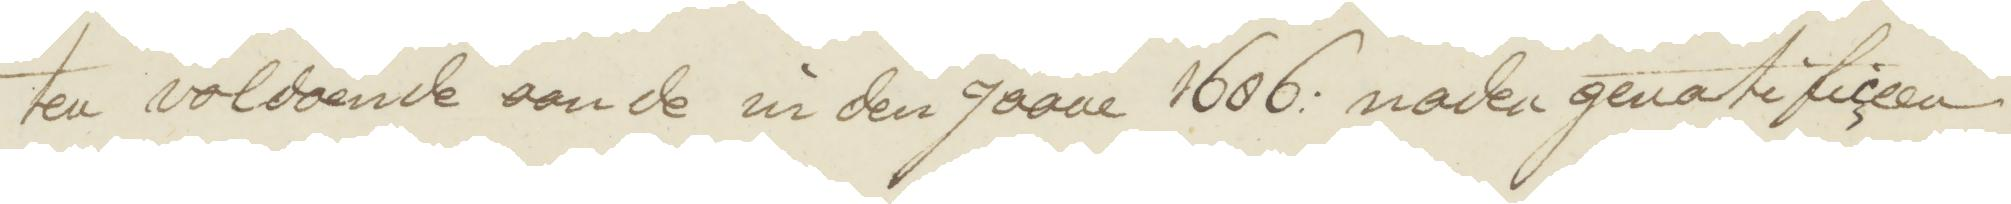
ter voldoende aan de in den Jaare 1686: nader geratificeer
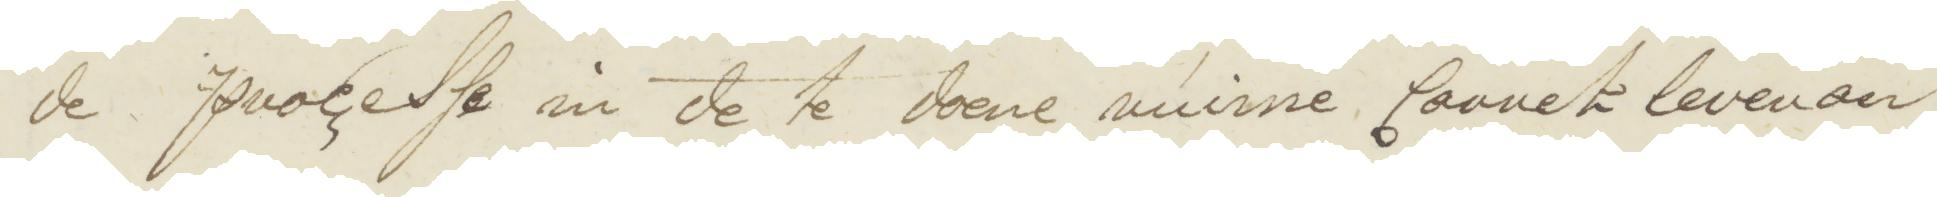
de processe in de te doene ruime cavret leveran
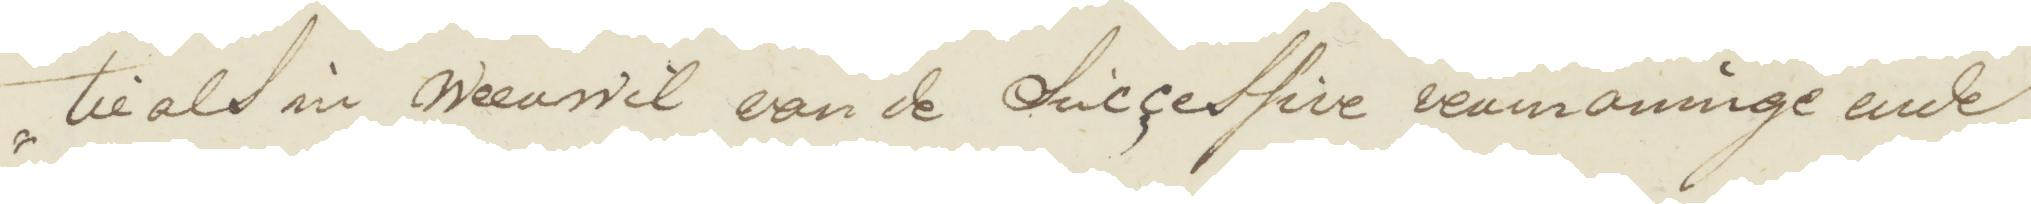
„tie als in weerwil van de successive vermaninge ende
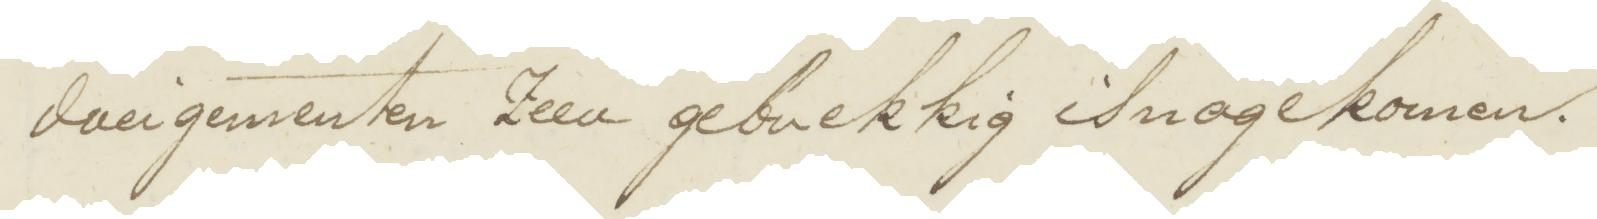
dreigementen zeer gebrekkig is nagekomen.
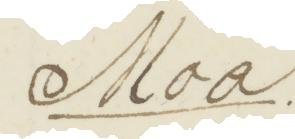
Moa.
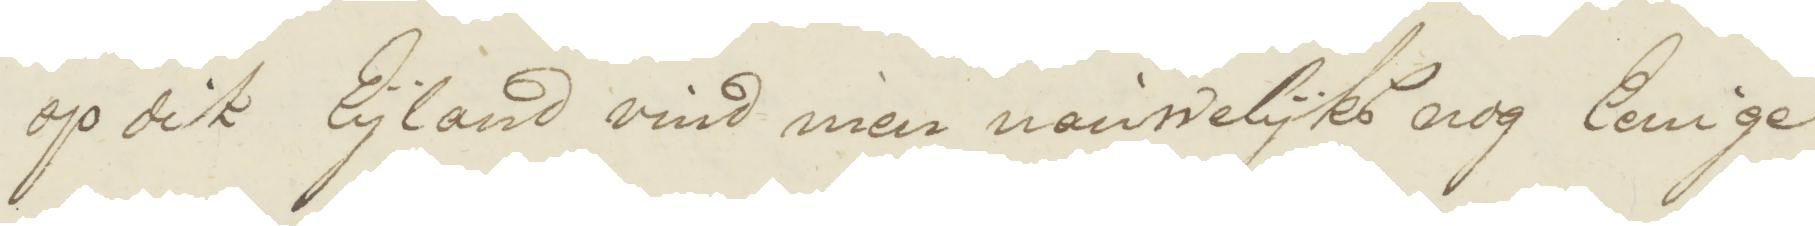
op dit Eijland vind men nauwelijks nog Eenige
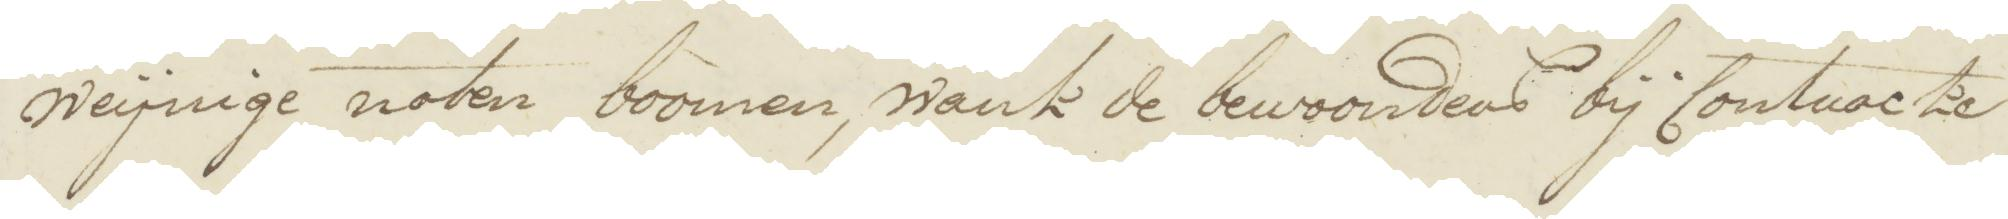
weijnige noten boomen, want de bewoonders bij contracte
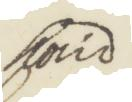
houd
